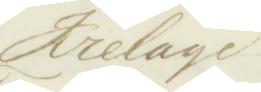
Krelage
